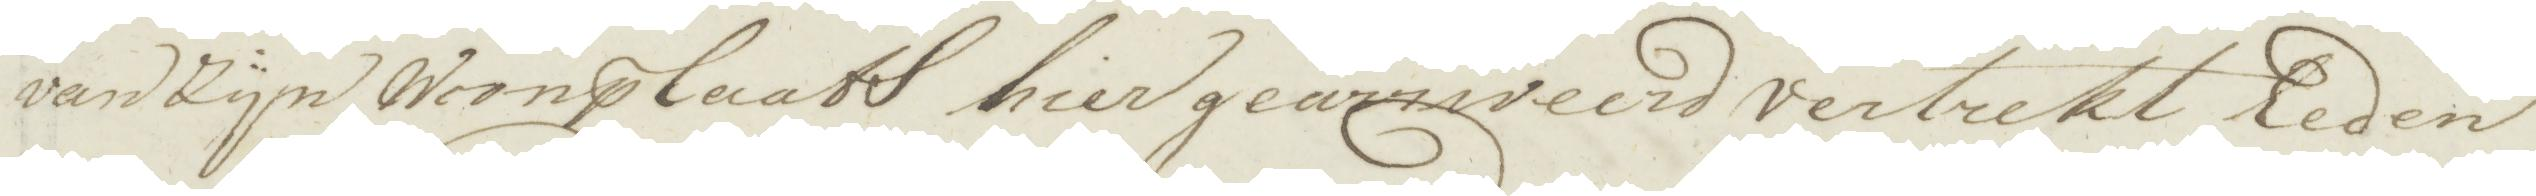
van Zijn woonplaats hier gearriveerd vertrekt heden
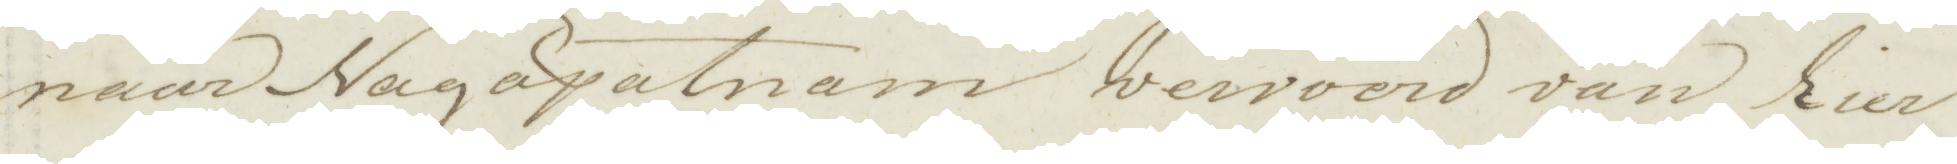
naar Nagapatnam vervoerd van hier
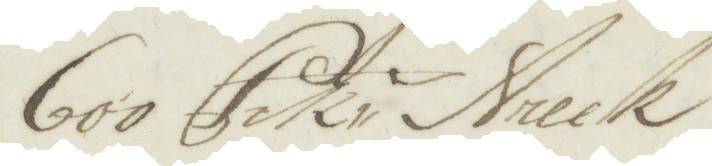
600 Pik„s Areek
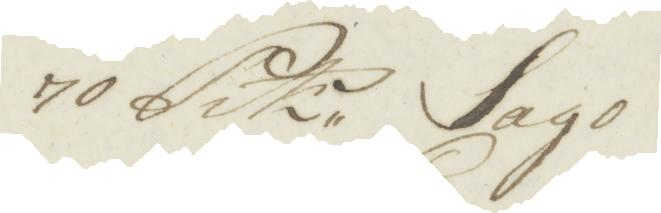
70 Pik„s Sago
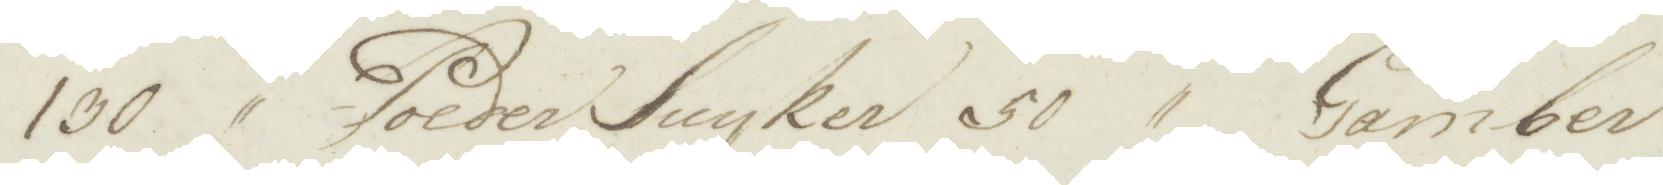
130 „ Poeder Suyker 50 „ Gamber
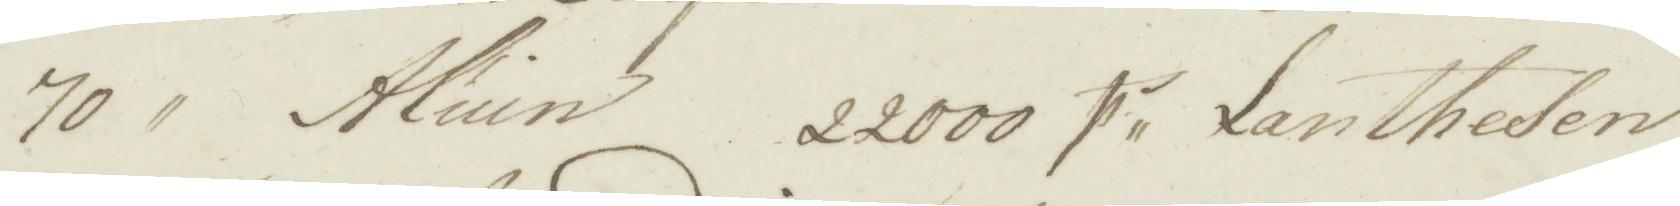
70 „ Aluin 22000 p„s Lanthesen
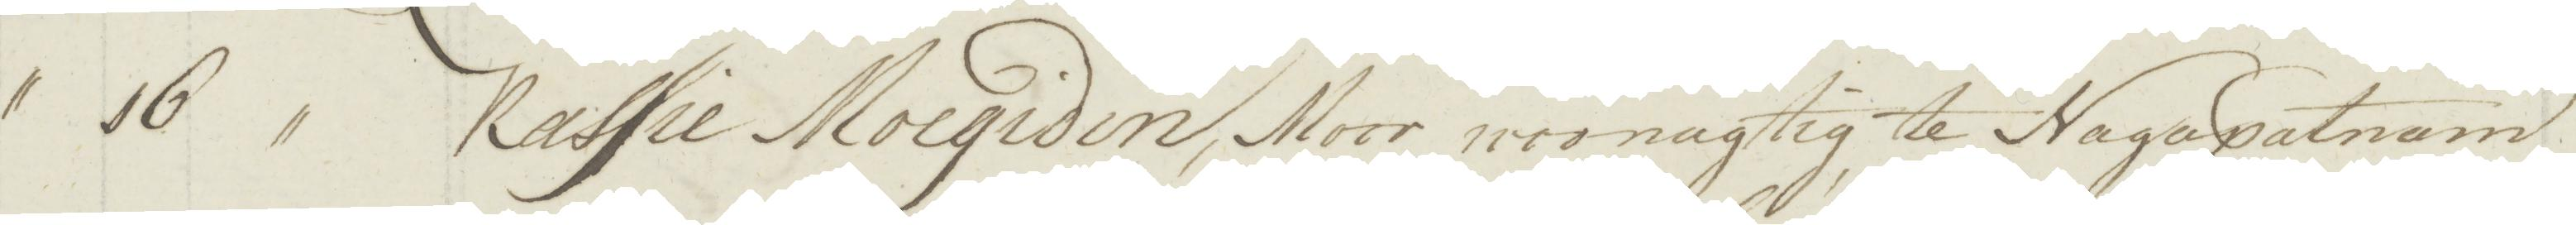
„ 16 „ Kassie Moegidin, Moor woonagtig te Nagapatnam
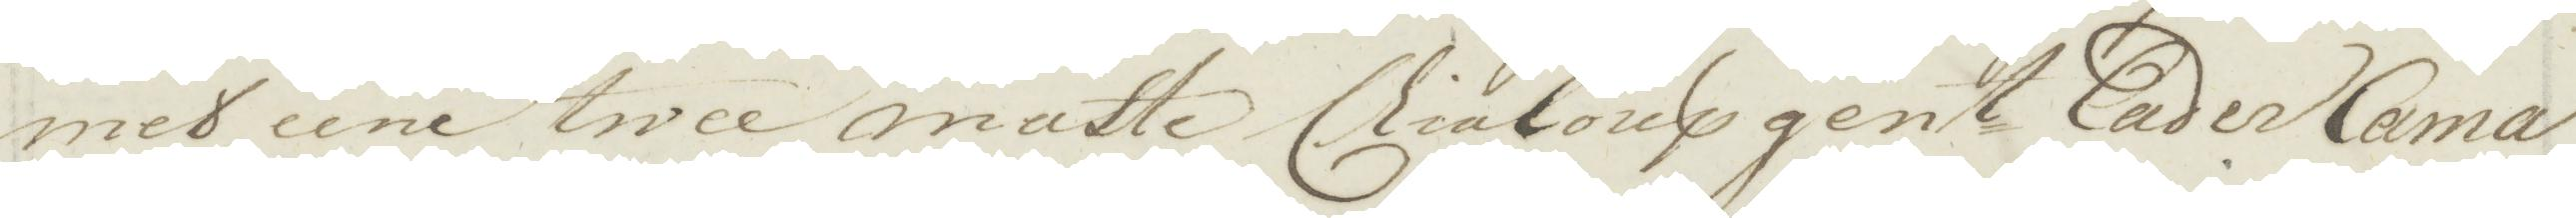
met eene twee maste Chialoup gen:t Cader Cama
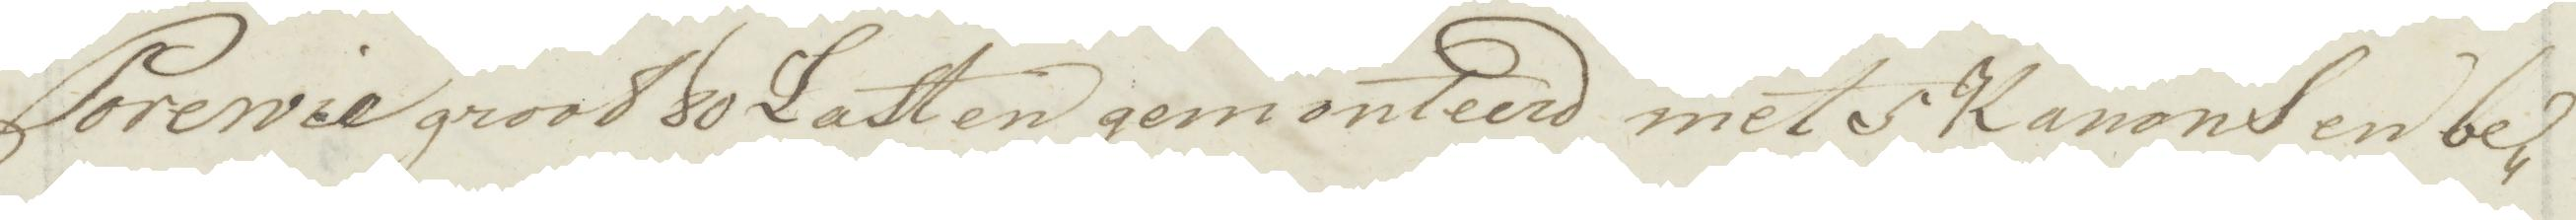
Porewie groot 80 Lasten gemonteerd met 5 Kanons en be„
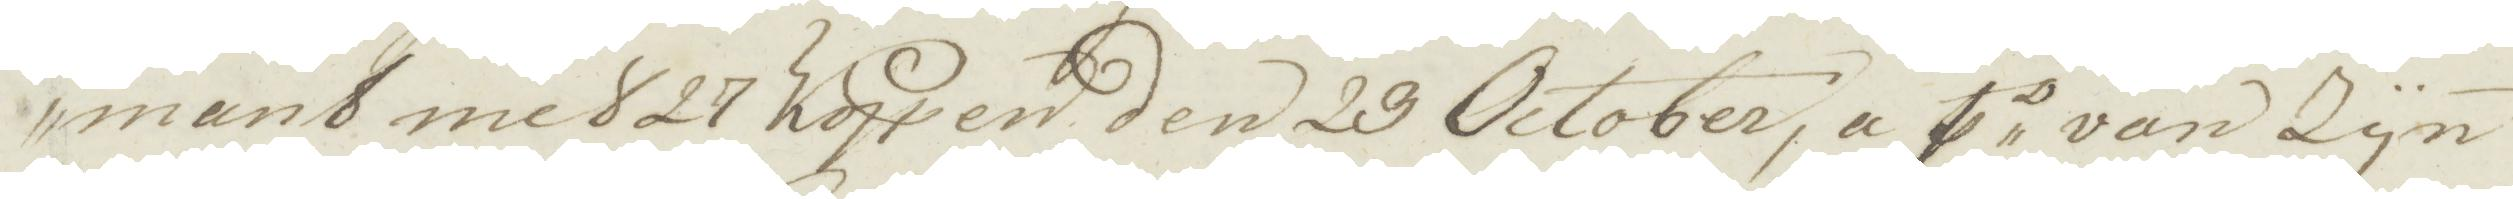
„mant met 27 Koppen den 23 October, a p„o van Zijn
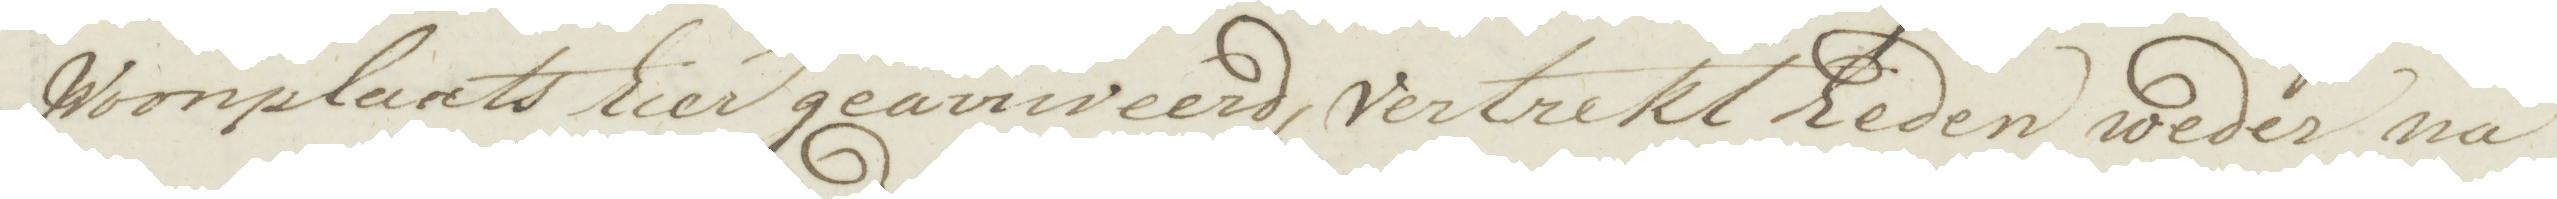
woonplaats hier gearriveerd, vertrekt heden weder na
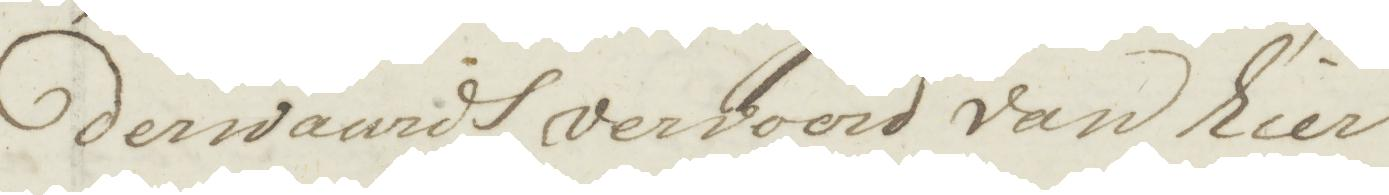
derwaards vervoerd van hier
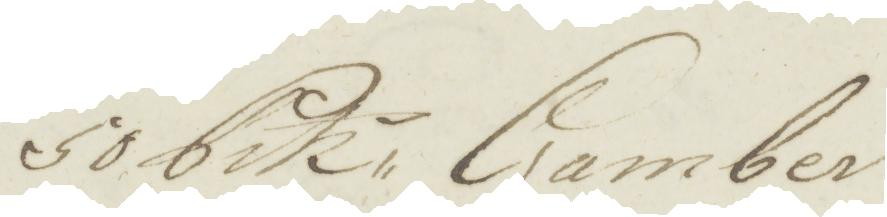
50 Pik„s Gamber
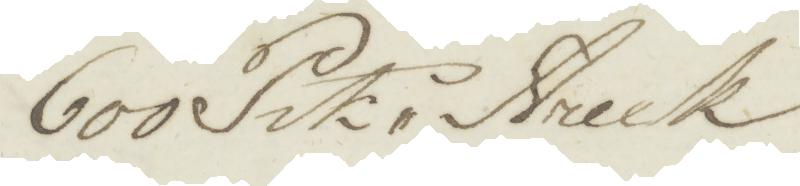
600 Piks„ Areek
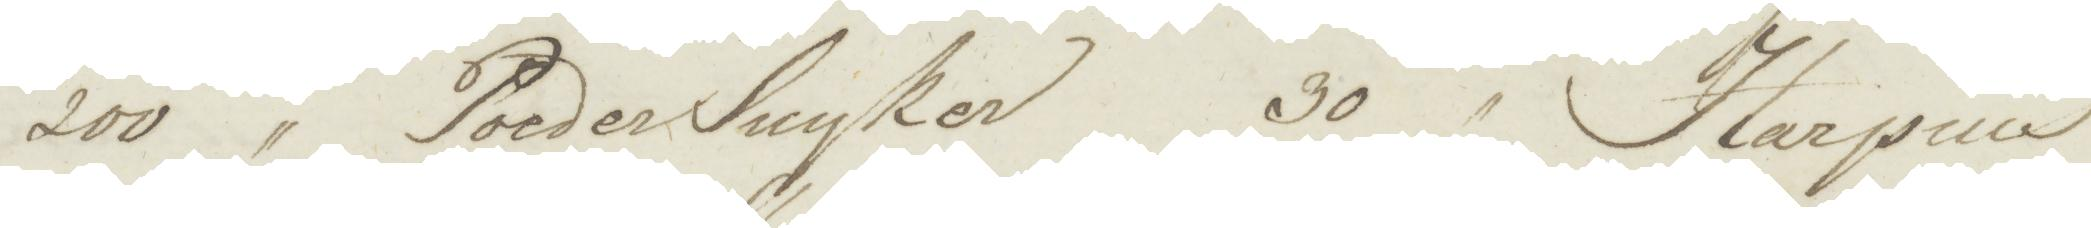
200 „ Poeder Suyker 30 „ Harpuis
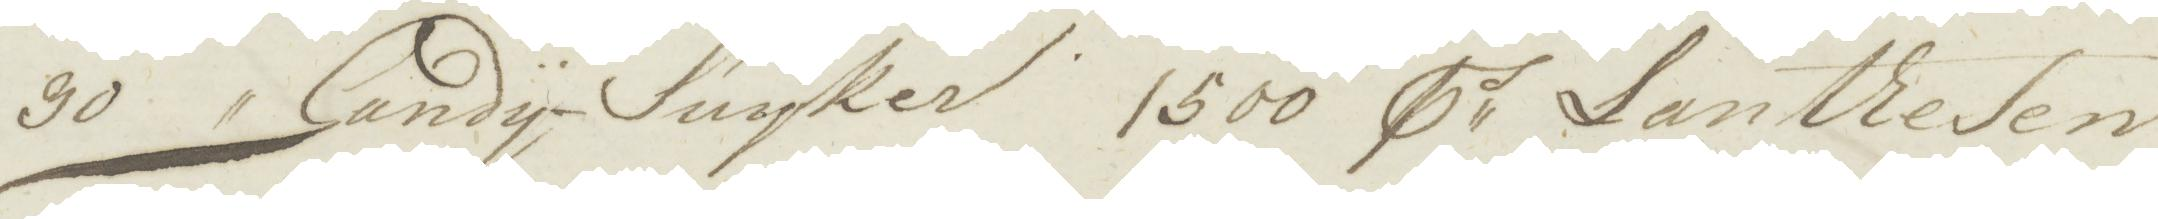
30 „ Candij-Suijker 1500 p„s Lanthesen
